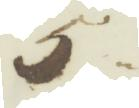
5 „ —
